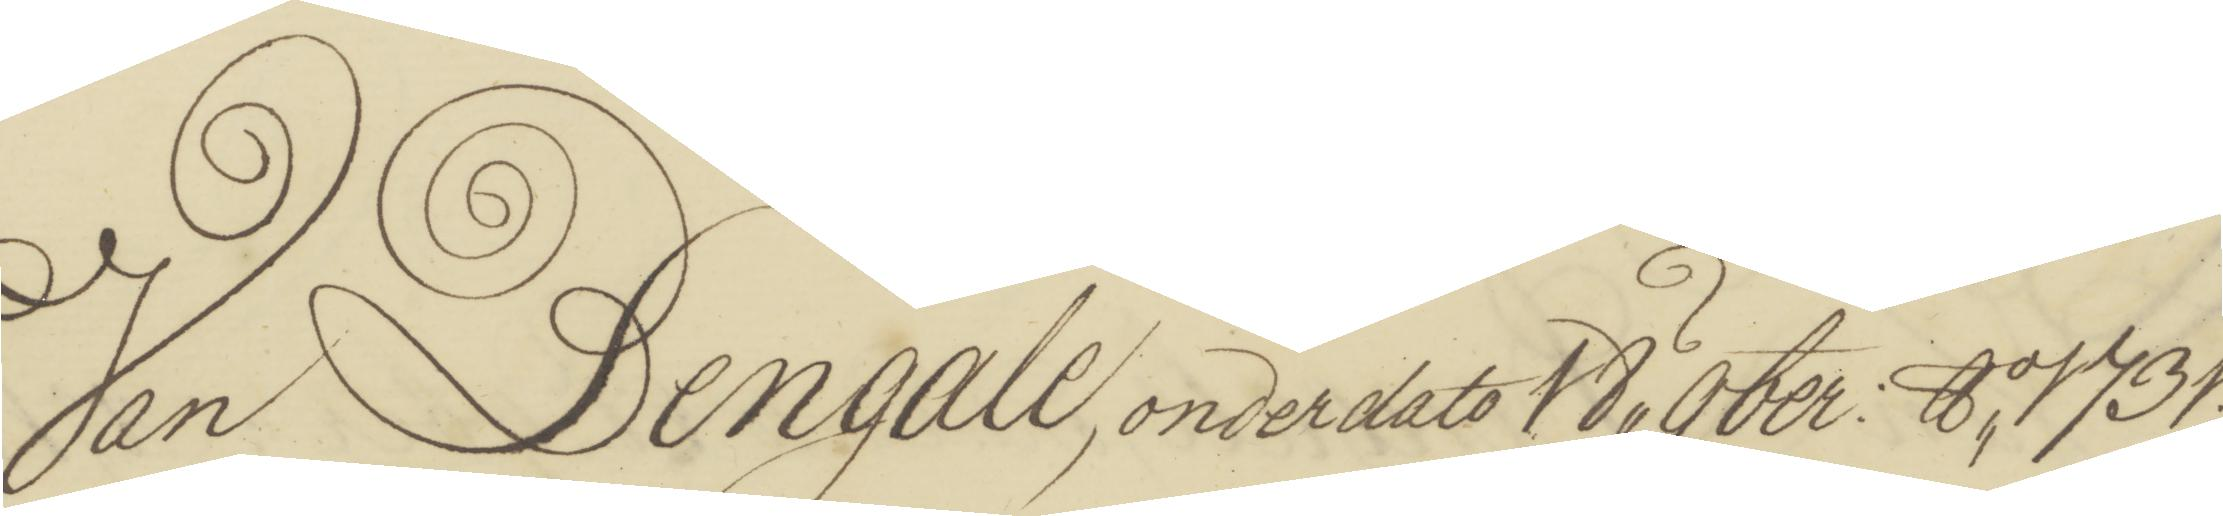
Van Bengale, onder dato 18' 9ber: A:o 1731
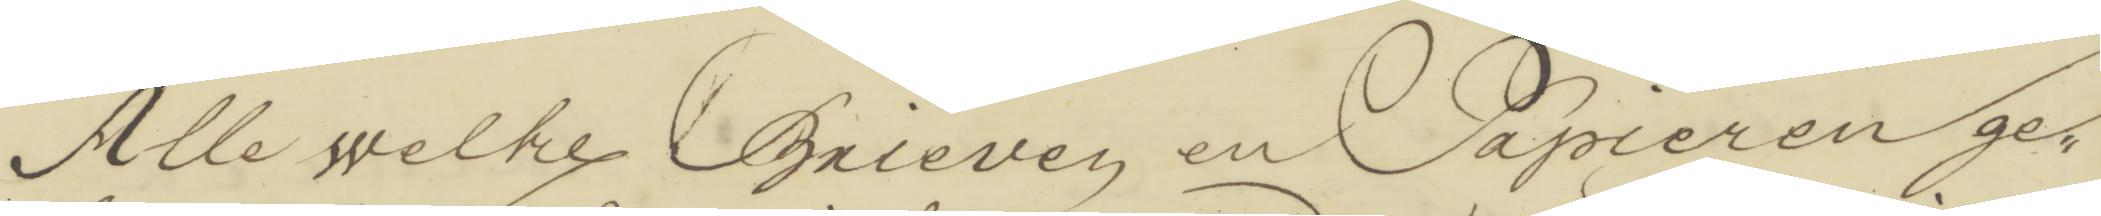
Alle welke Brieven en Papieren ge„
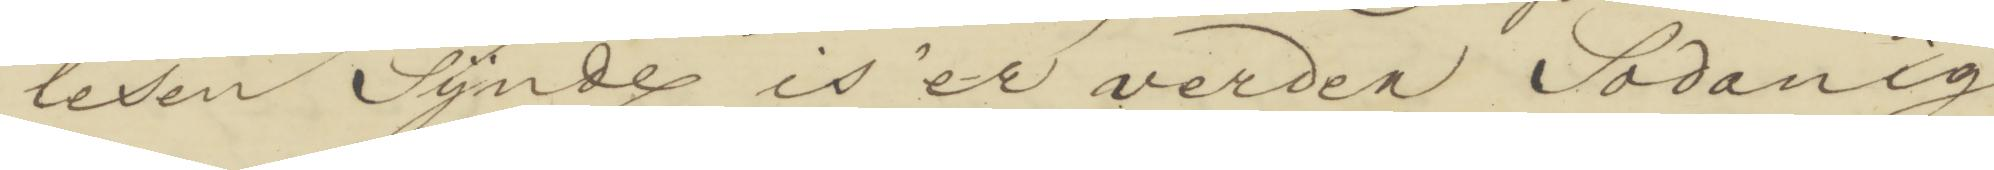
lesen Sijnde is er verder Sodanig
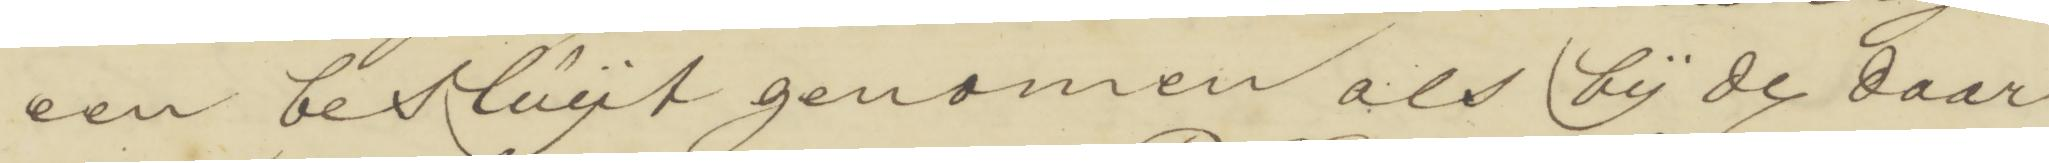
een besluijt genomen als bij de daar
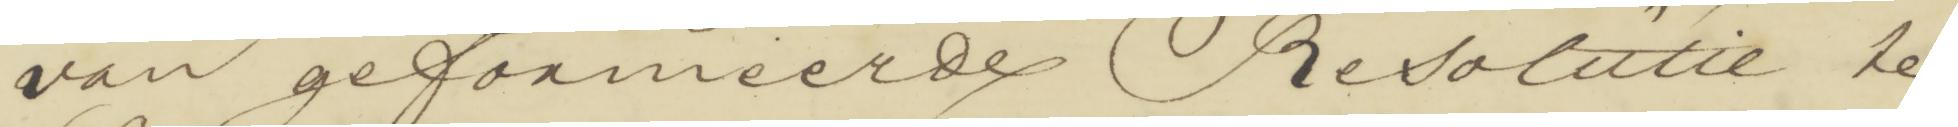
van geformeerde Resolutie te
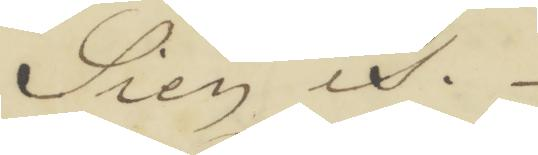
Sien is.
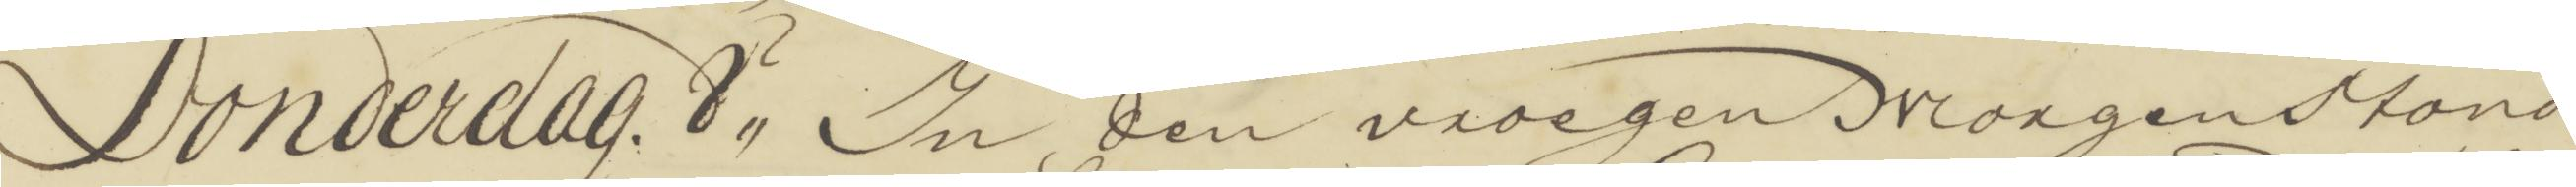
Donderdag. 8' „ In den vroegen Morgenstond
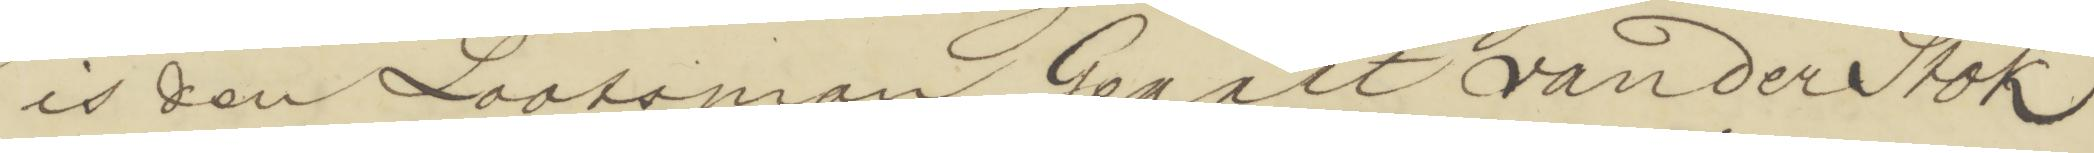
is den Lootsman Gerrit van der Stok
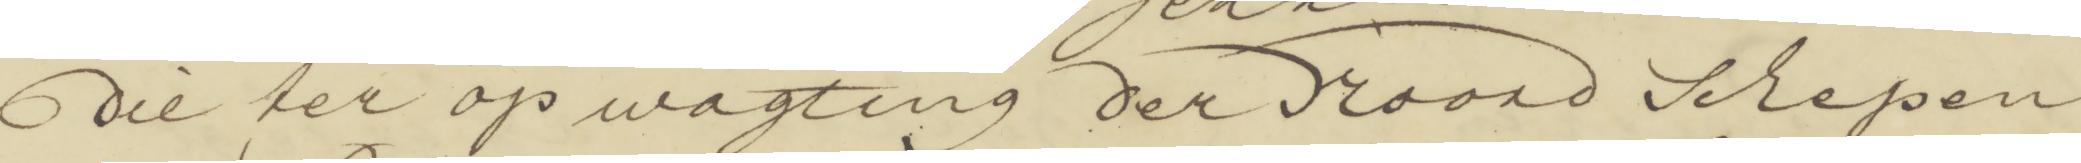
die ter op wagting der Noord schepen
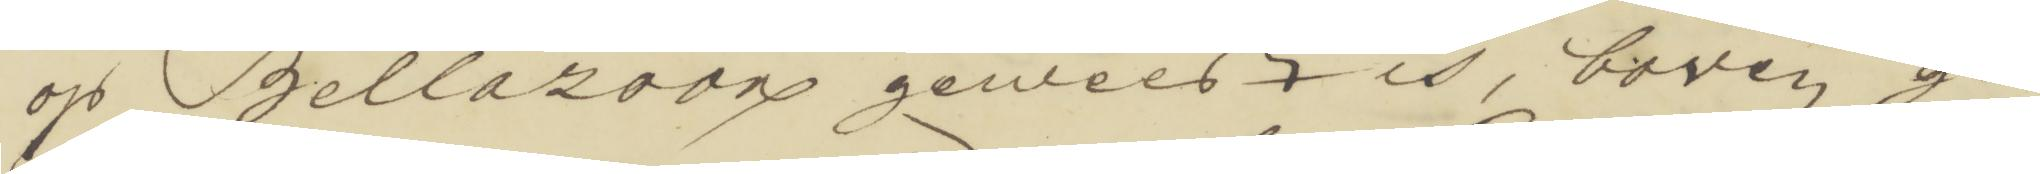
op Bellazoor geweest is, boven ge
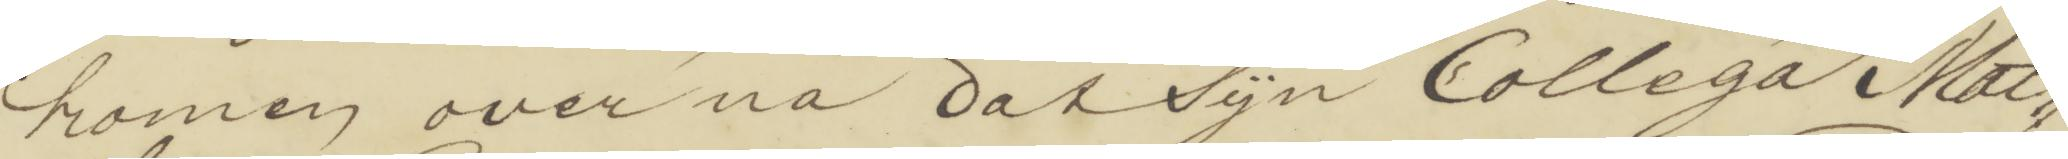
komen over na dat Sijn Collega Mat„
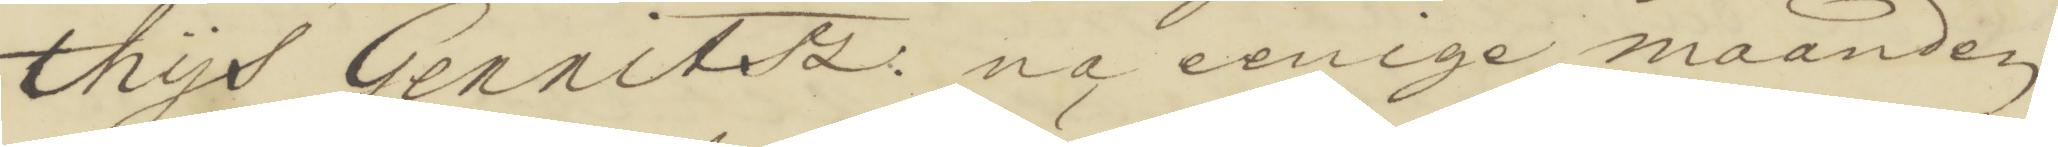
thijs Gerritsz: na eenige maanden
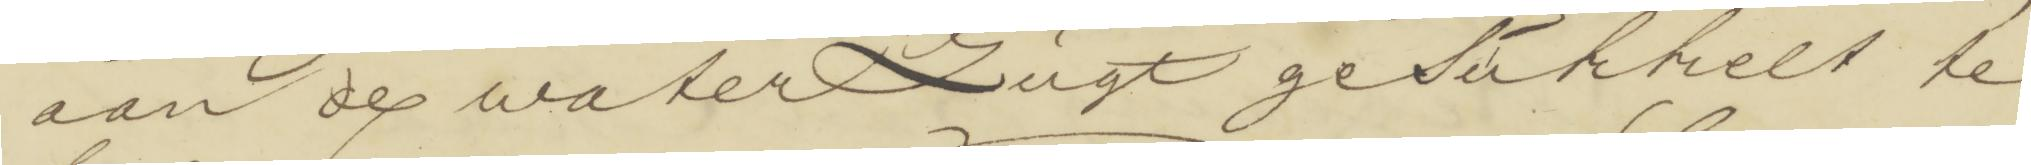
aan de water Zugt gesukkelt te
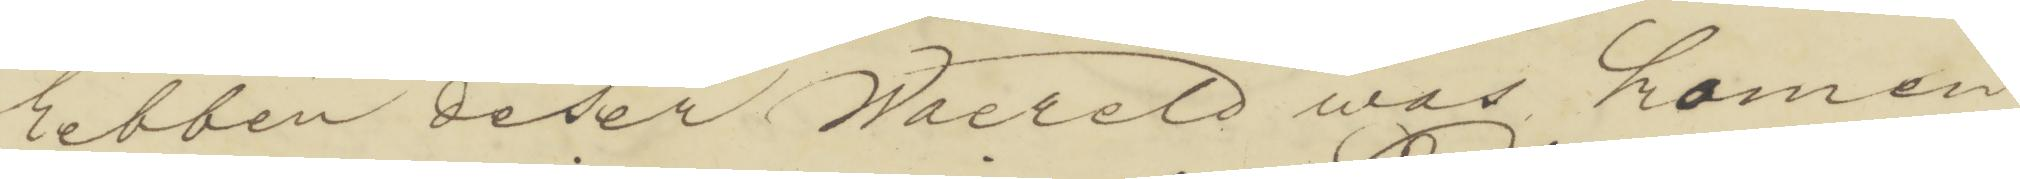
hebben deser waereld was komen
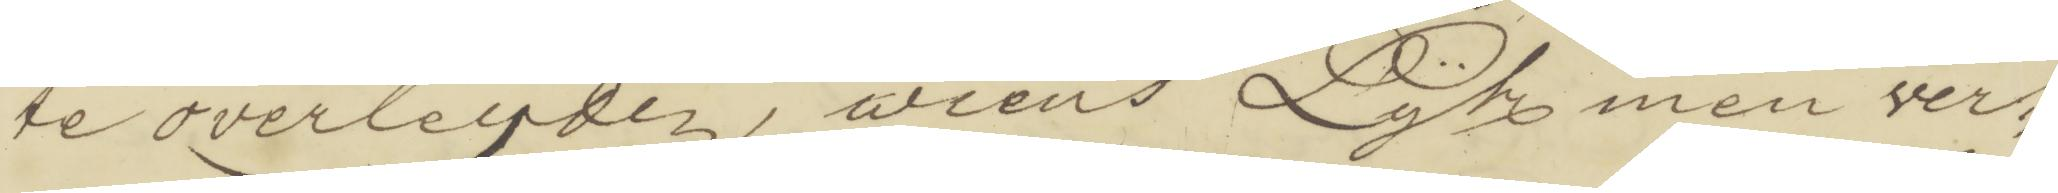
te overleijden, wiens Lijk men ver„
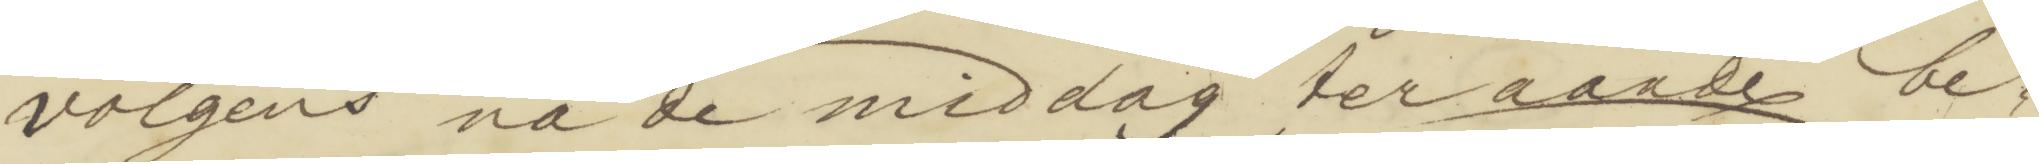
volgens na de middag ter aarde be„
